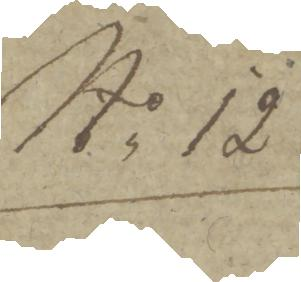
N„o 12
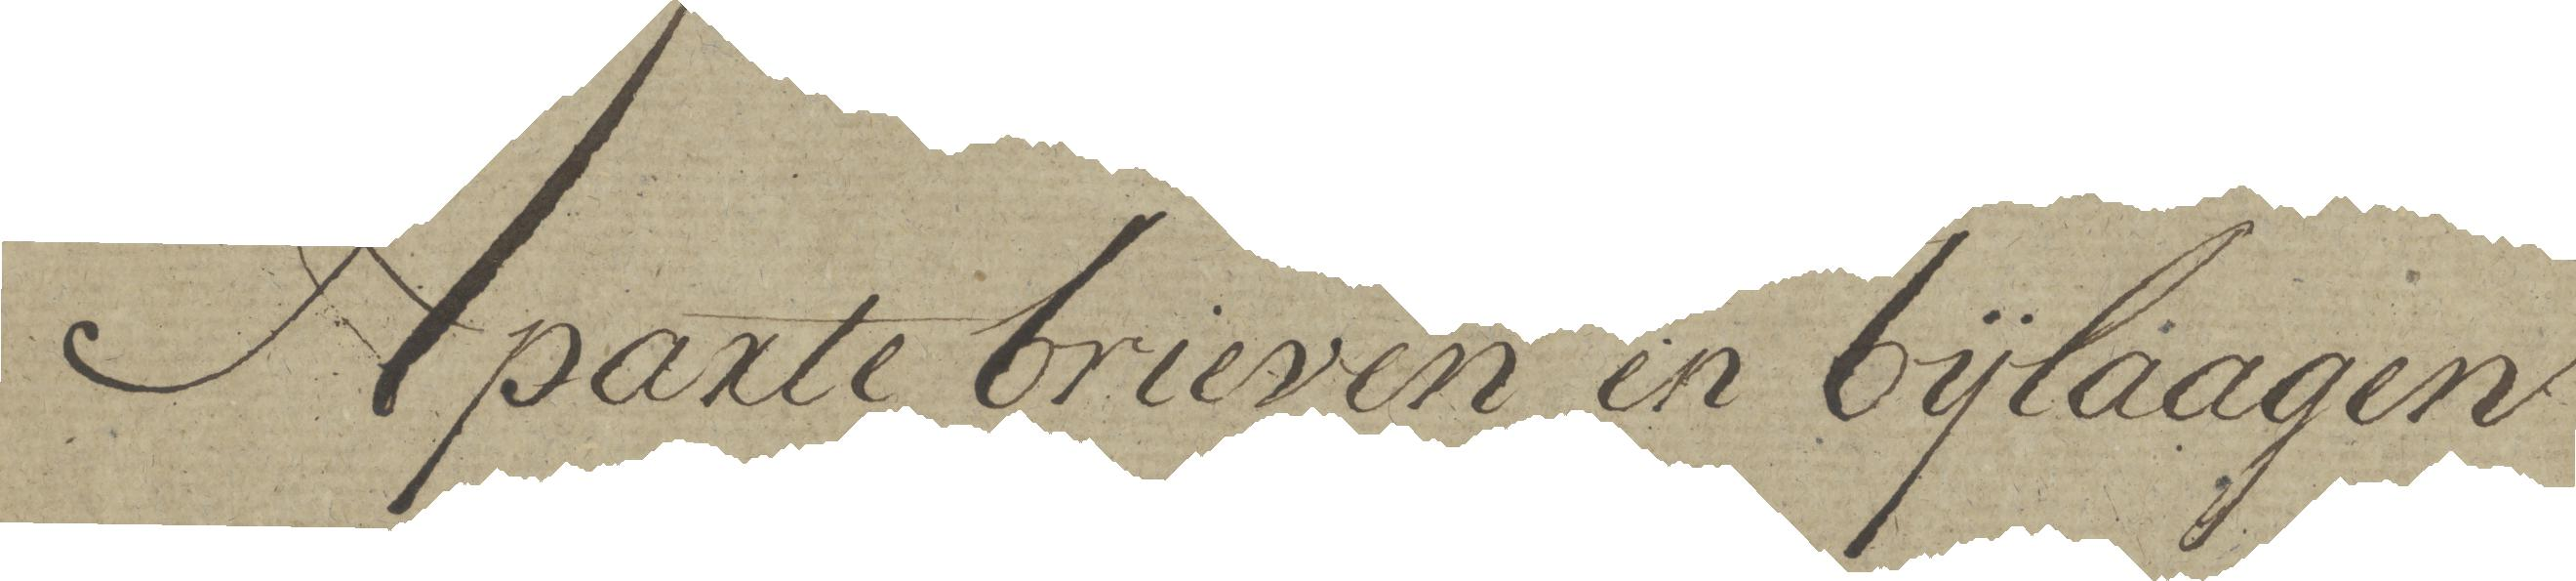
Aparte brieven en bijlaagen
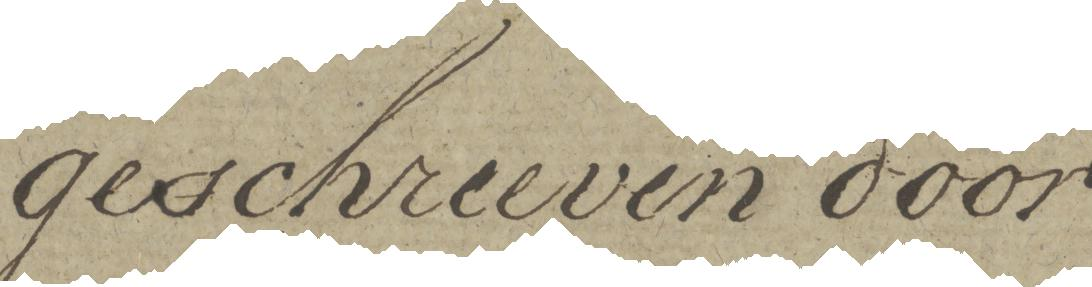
geschreeven door
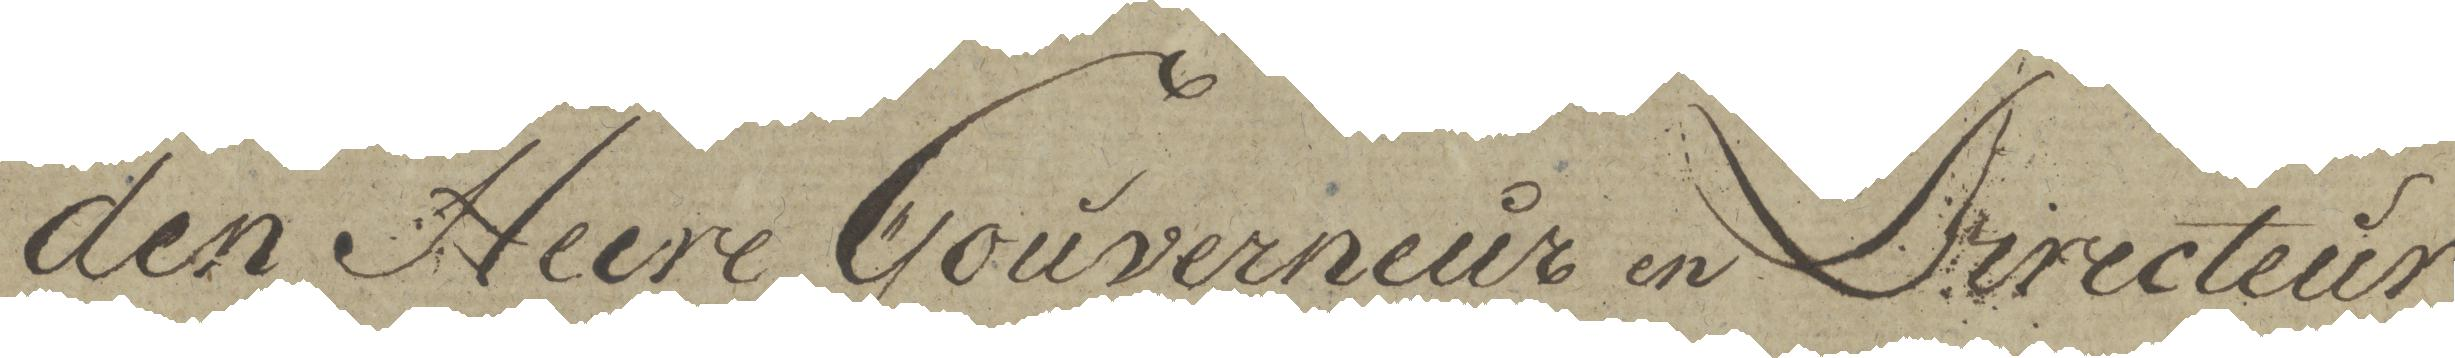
den Heere Gouverneur en Directeur
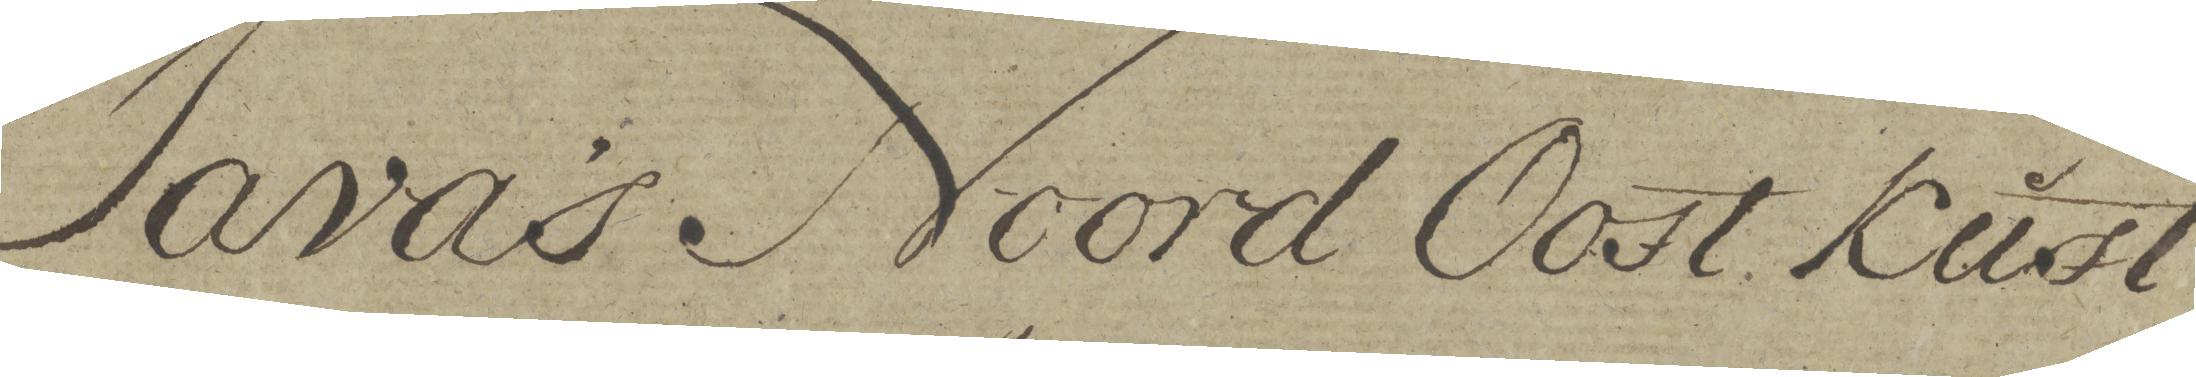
Iava's Noord Oost Kust
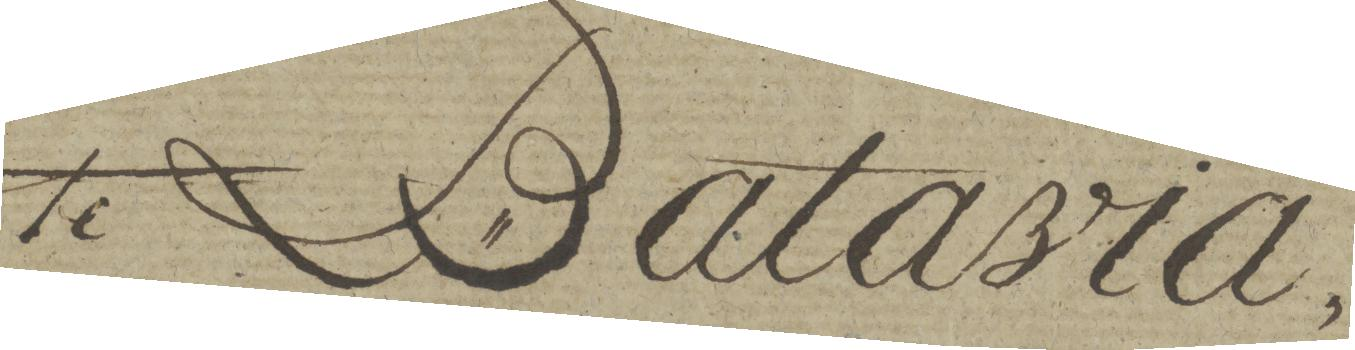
te Batavia,
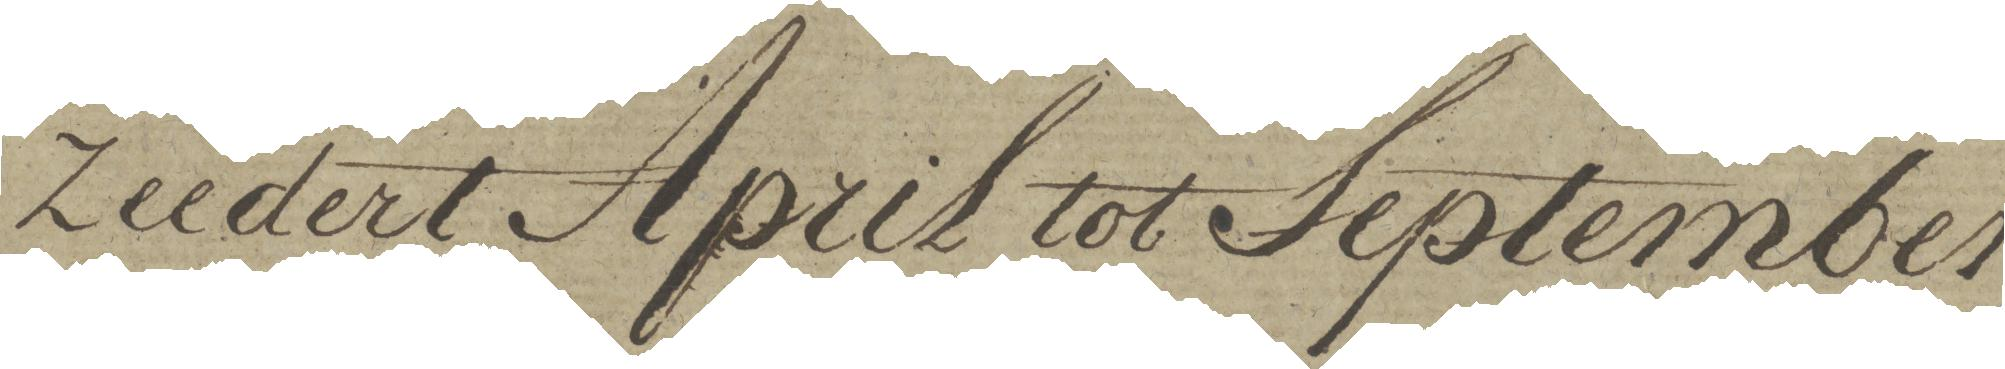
Zeedert April tot September
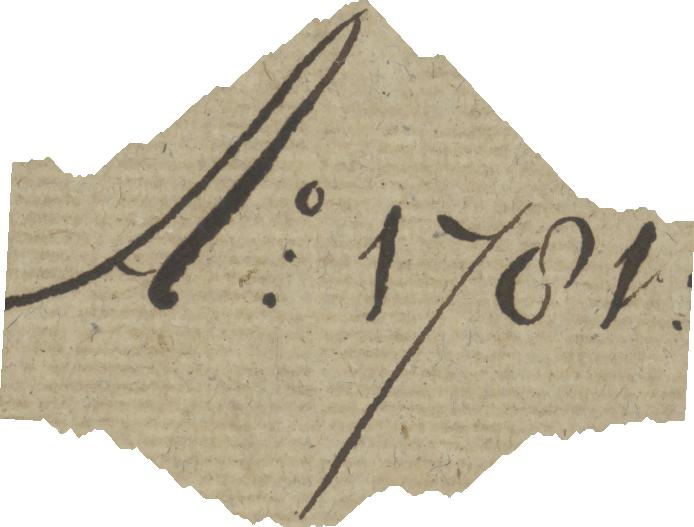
A:o 1781
